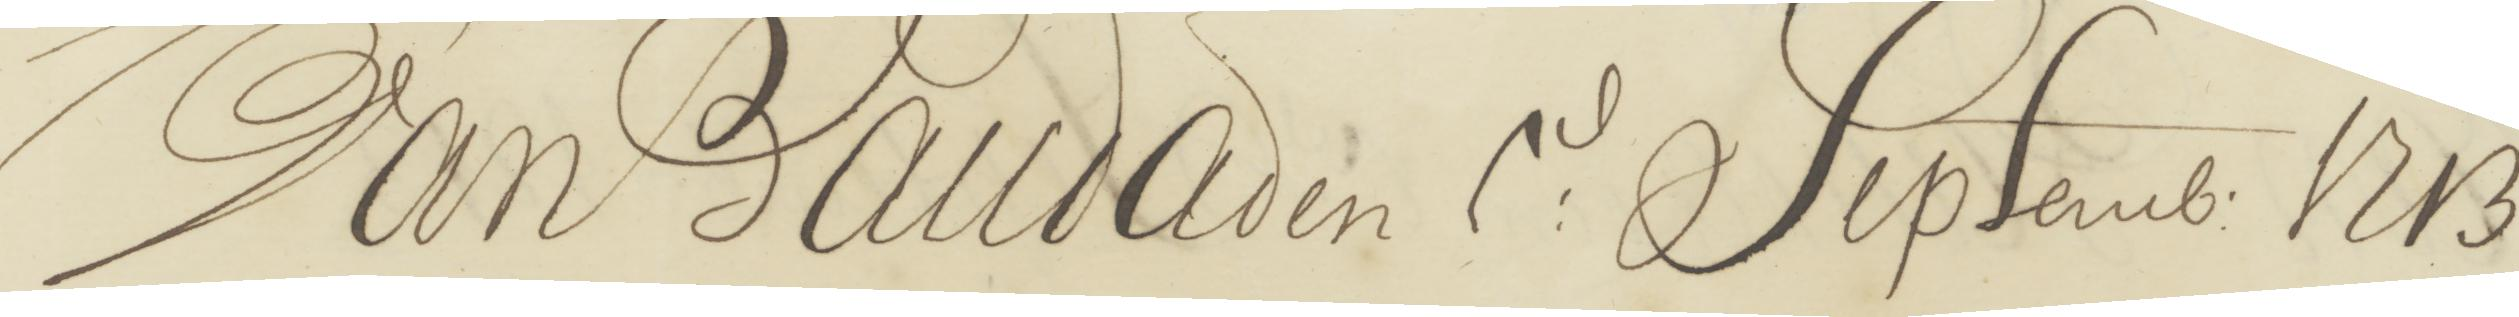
Van Banda den 5:e Septemb: 1713
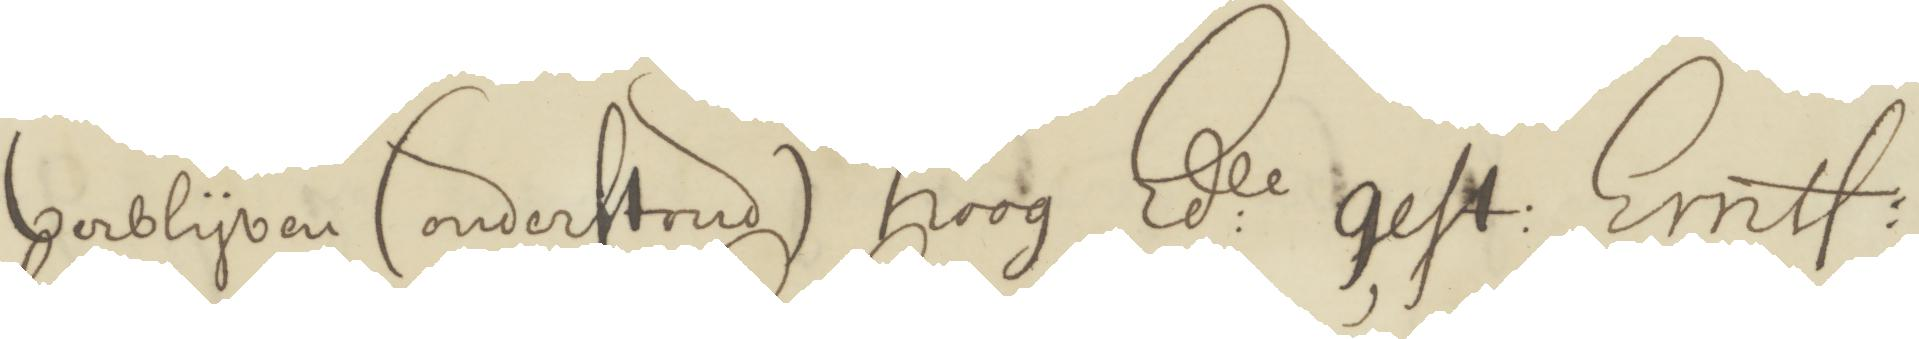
verblijven (onderstond) hoog Ed=le gest: Erntf:
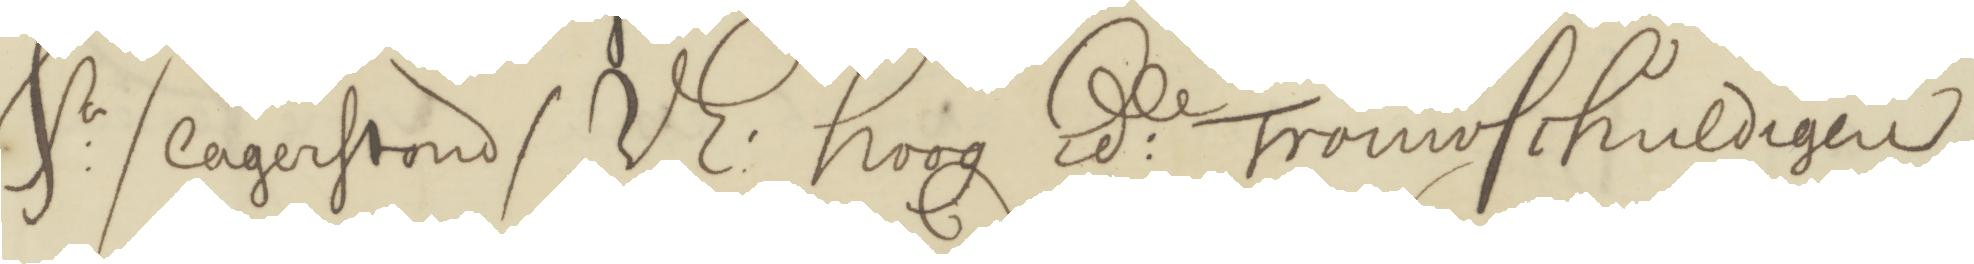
&:a /lagerstond:/ VE: hoog Ed:le Trouwe schuldigen
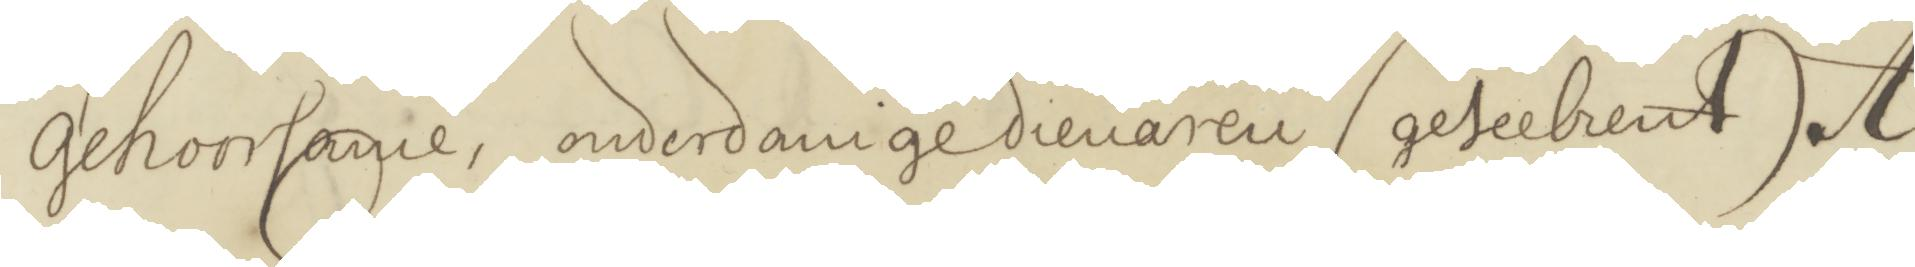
gehoorsame, onderdanige dienaren (geteekent) A
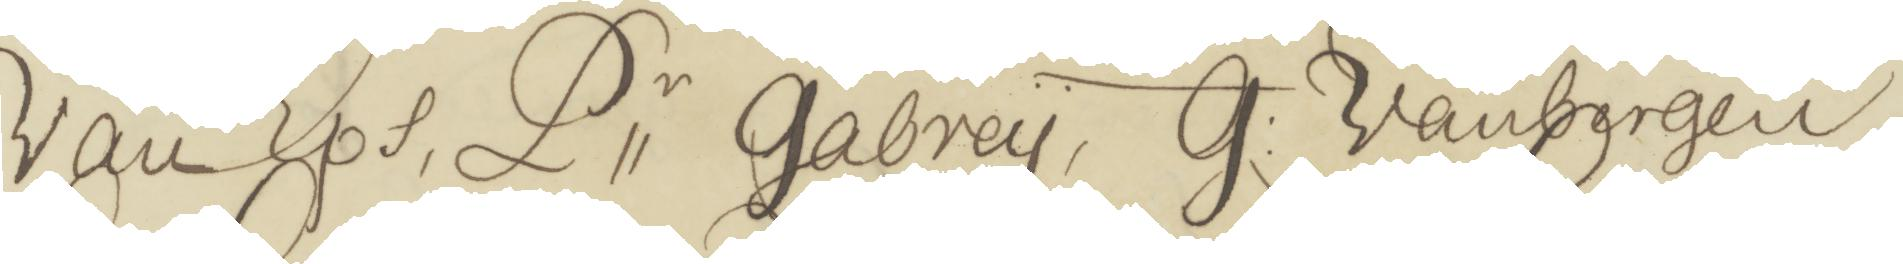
van Eps, P„r Gabreij, G: Vanbergen
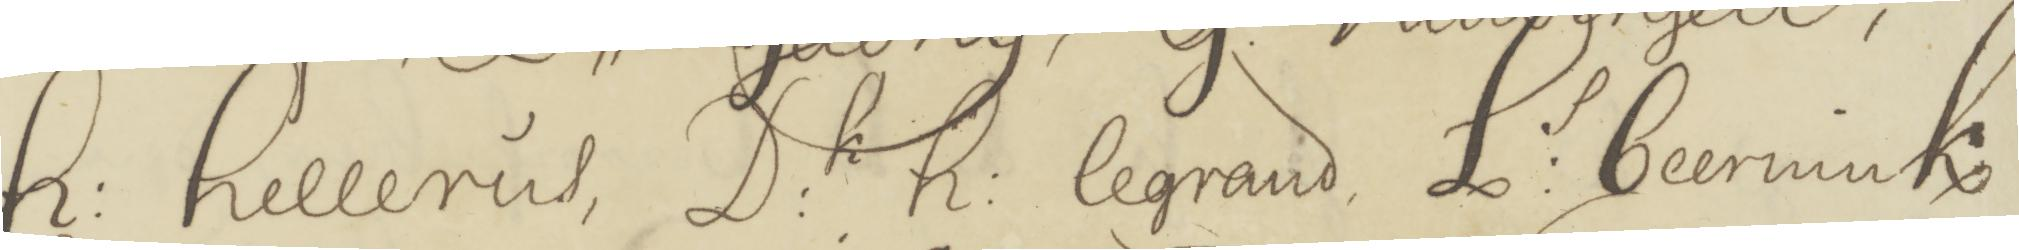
h: hellerus, D:k h: legrand, L:s beernink
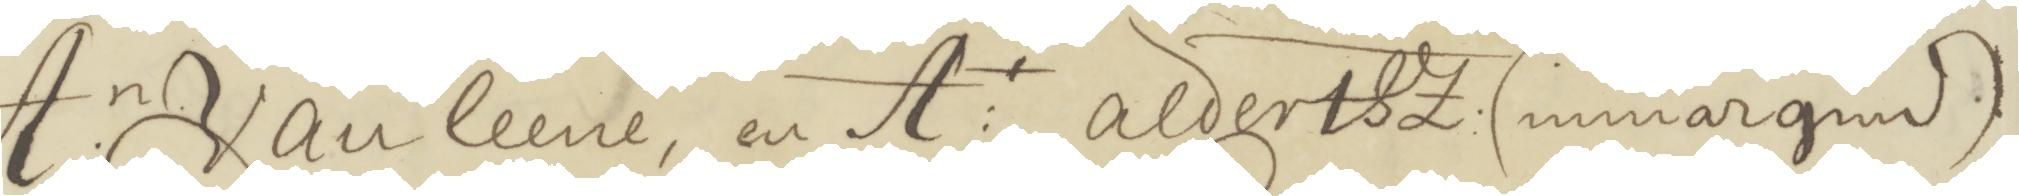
A:n van leene, en A:t aldertsz: (in margine)
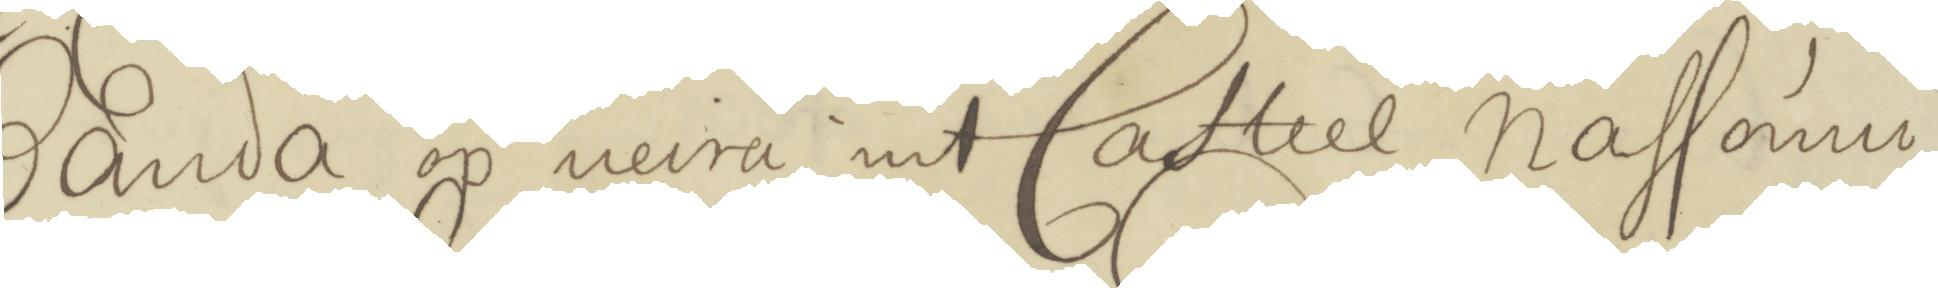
banda op neira int Casteel nassouw
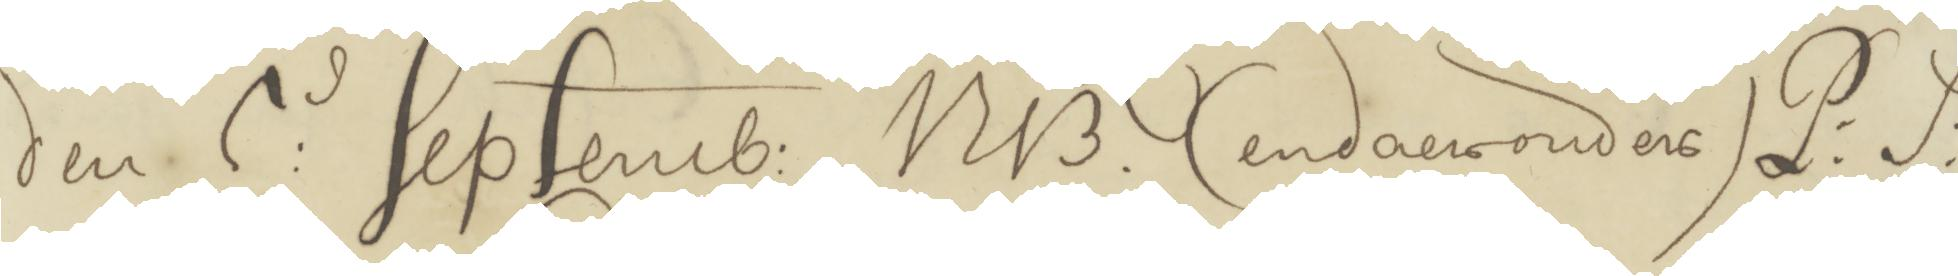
den 5:e septemb: 1713. (en daer onder) P: S
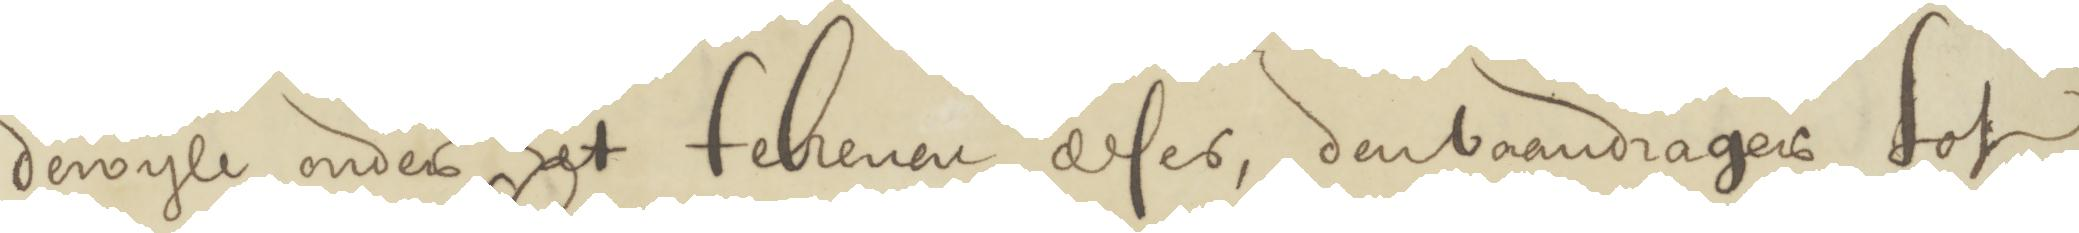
dewijle onder het tekenen deses, den vaandragers tot
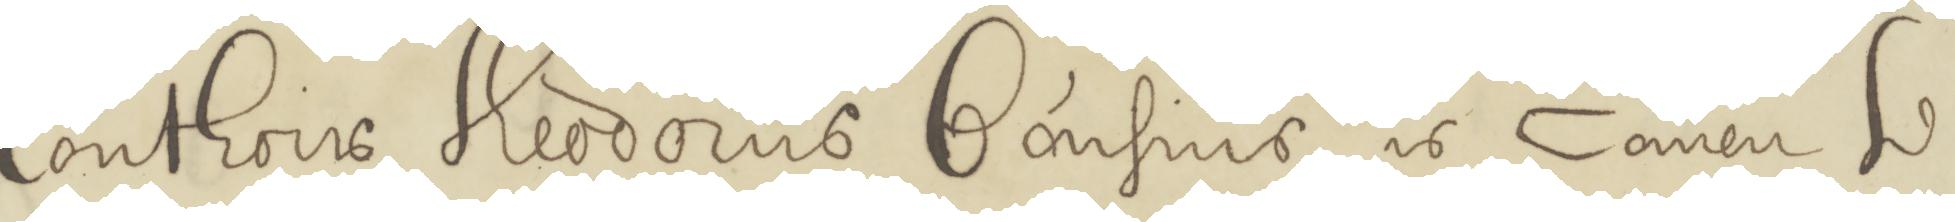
lonthous theodorus bousius is comen te
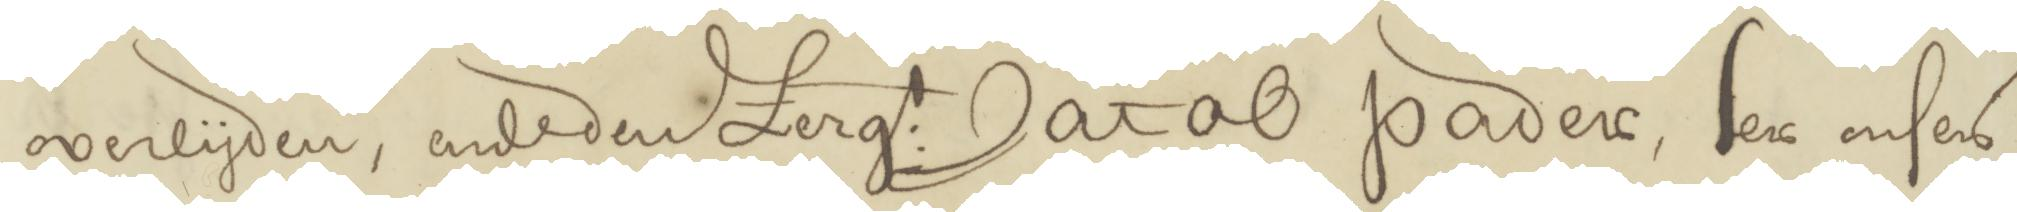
overlijden, ende den Zerg:t Jacob pader, ter onser
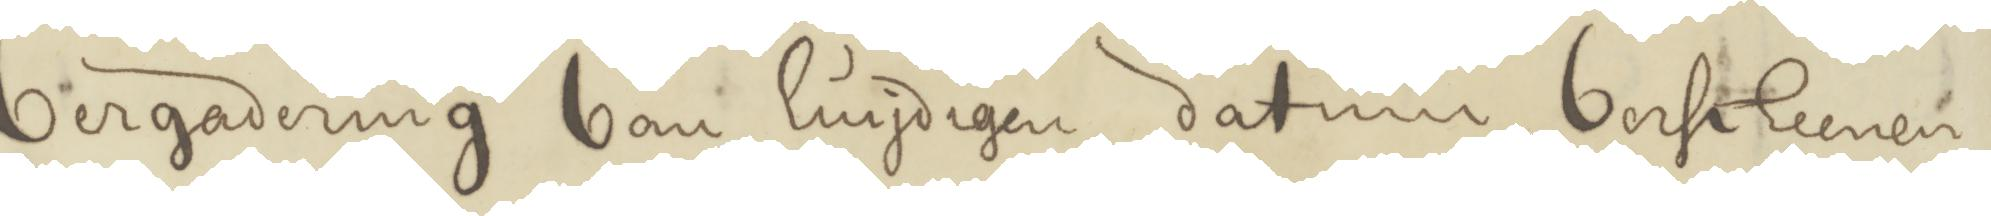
vergadering van huijdigen datum verscheenen
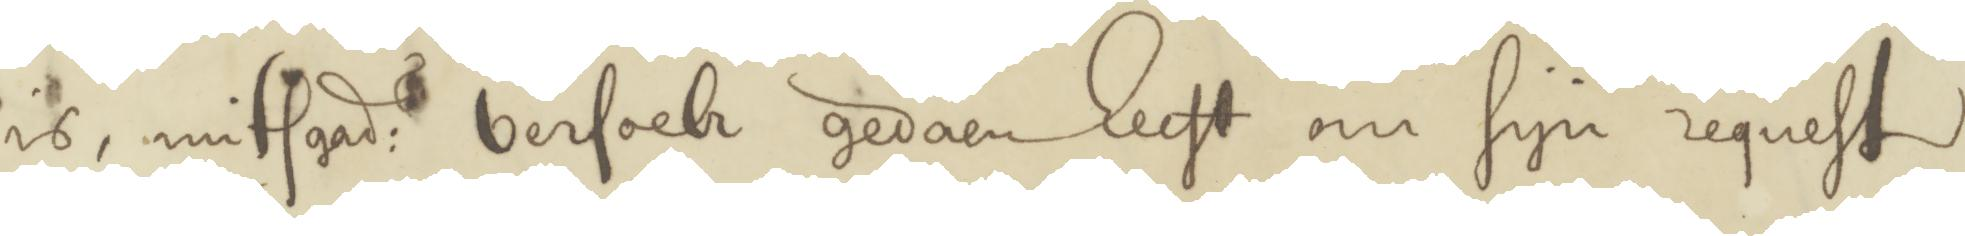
is, mitsgad:s versoek gedaen heeft om sijn request
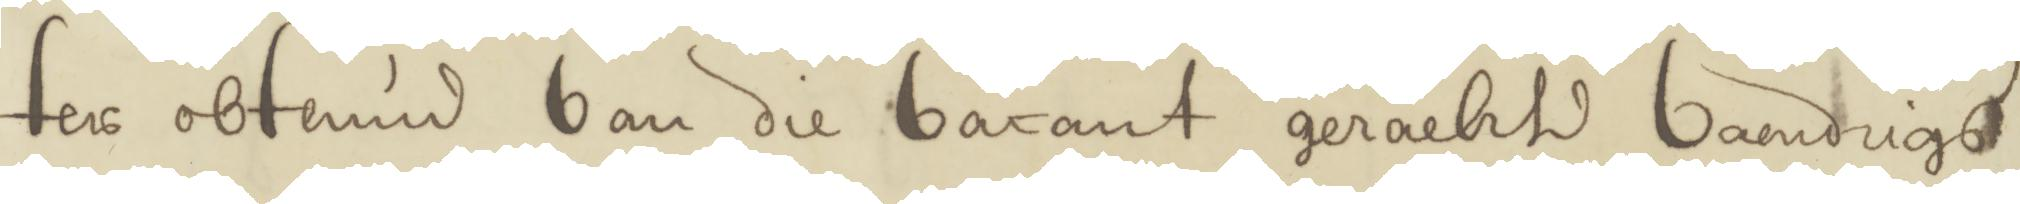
ter obtenue van die vacant geraekte vaendrigs
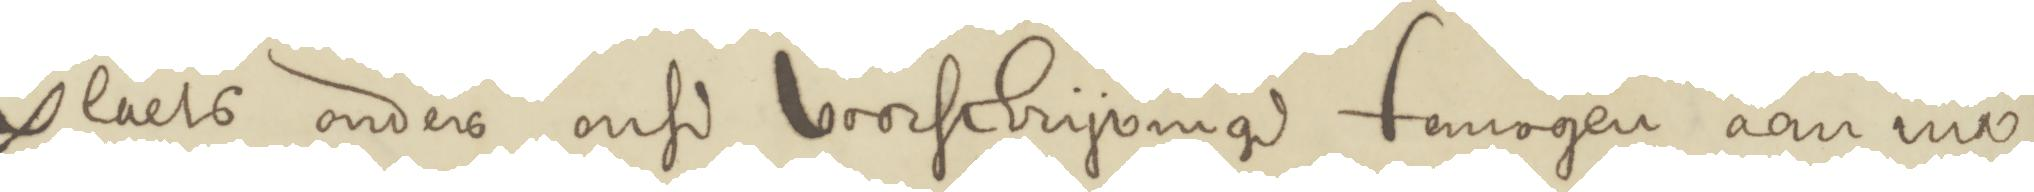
plaets onder onse voorschrijvinge temogen aan uw
